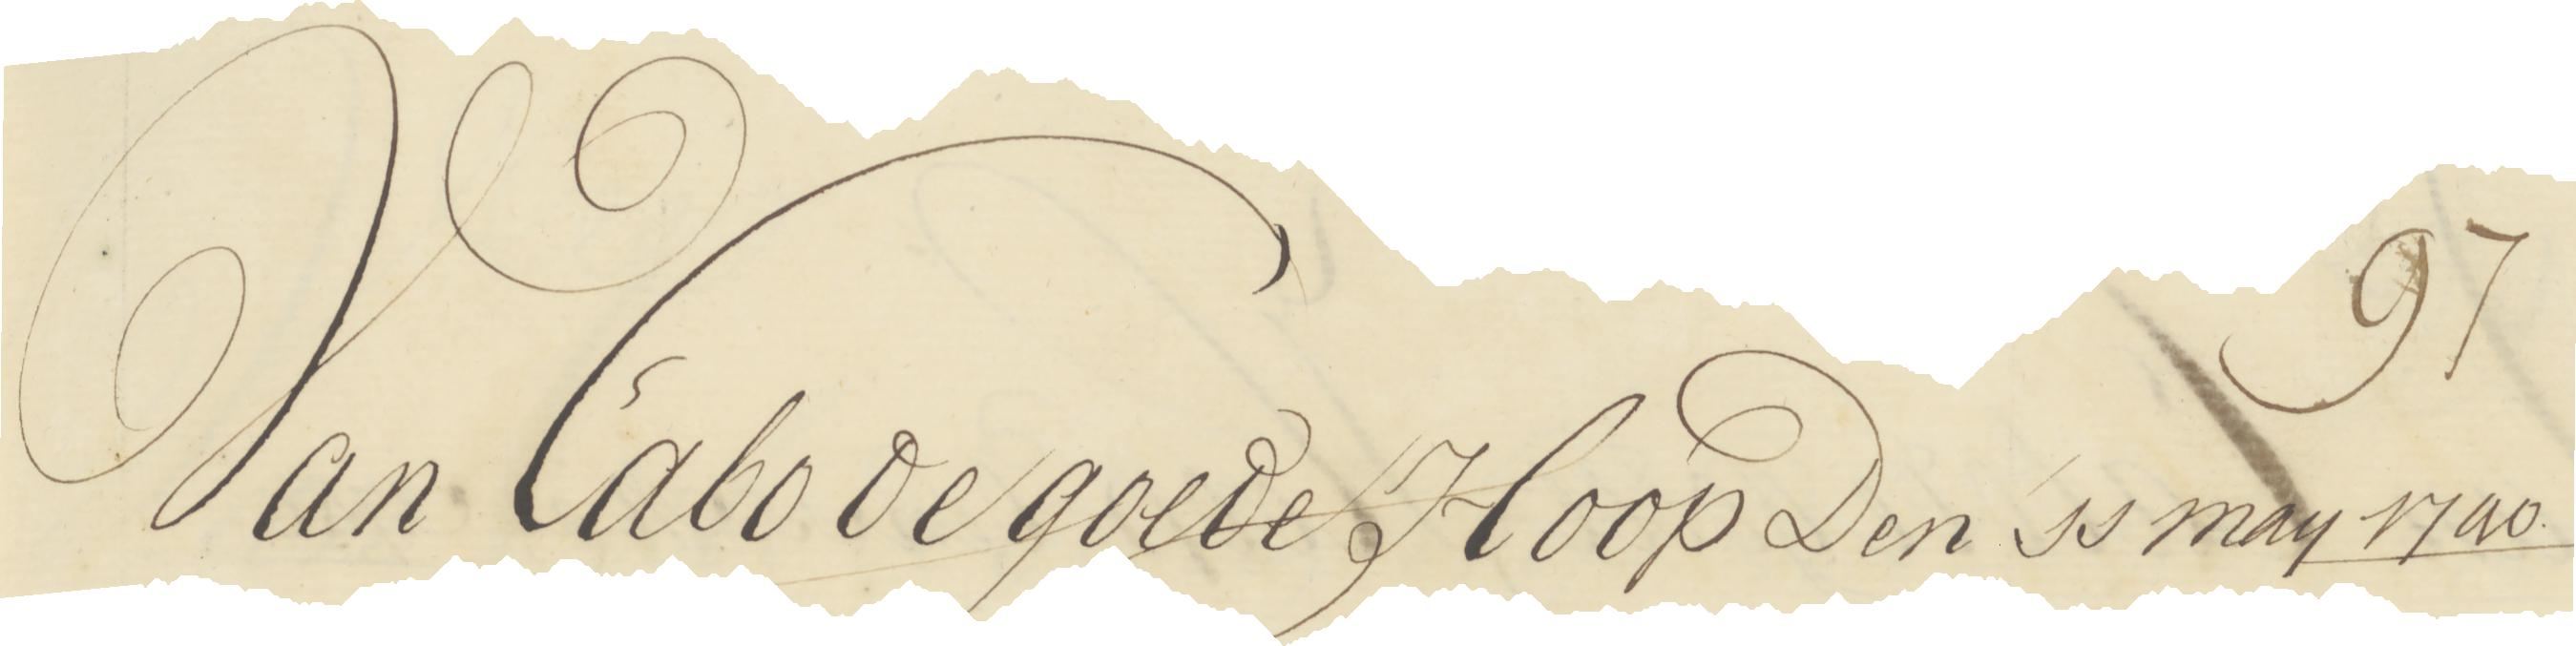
Van Cabo de goede Hoop Den 11 may 1740.
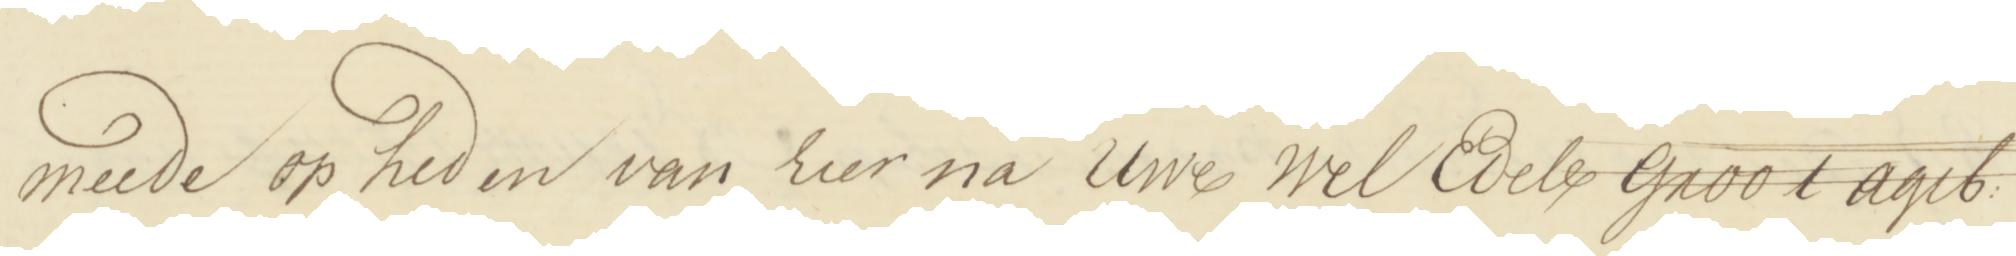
meede op heden van hier na uwe wel Edele Groot agtb:
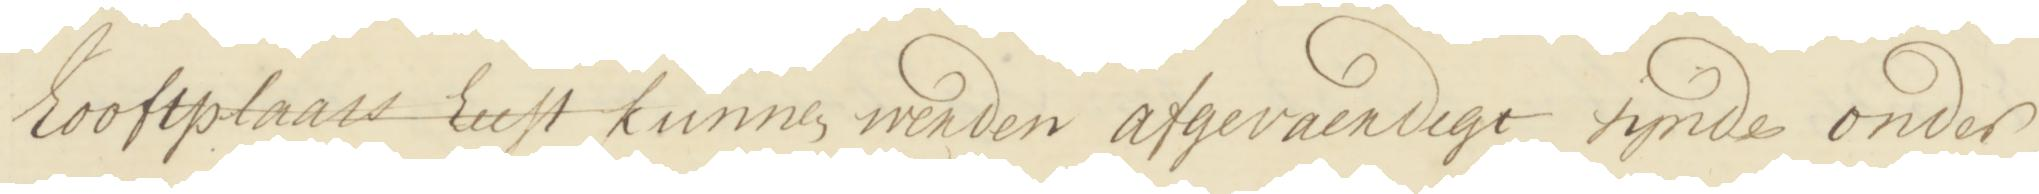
hooftplaats heeft kunnen werden afgevaerdigt synde onder
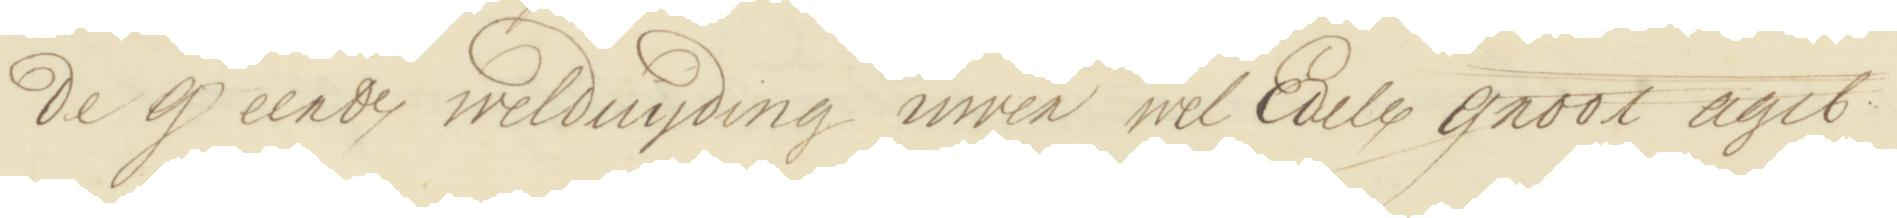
de g eerde welduijding uwer wel Edele groot agtb:
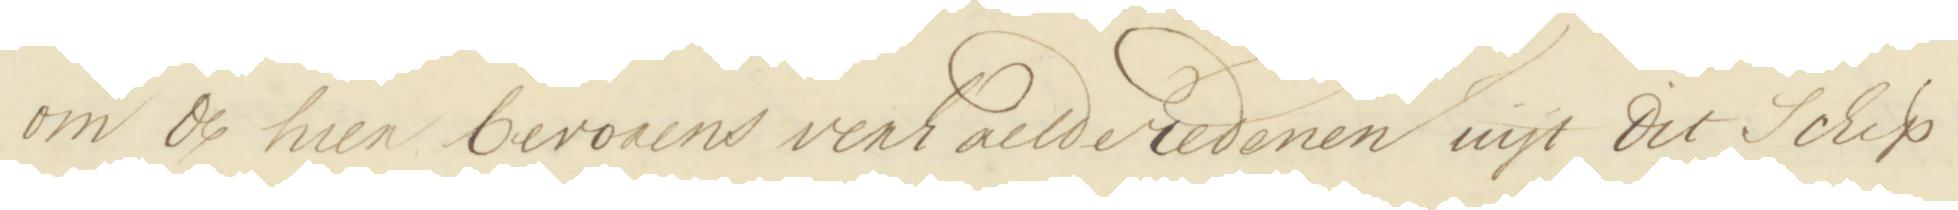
om de hier bevorens verhaelde redenen uijt dit schip
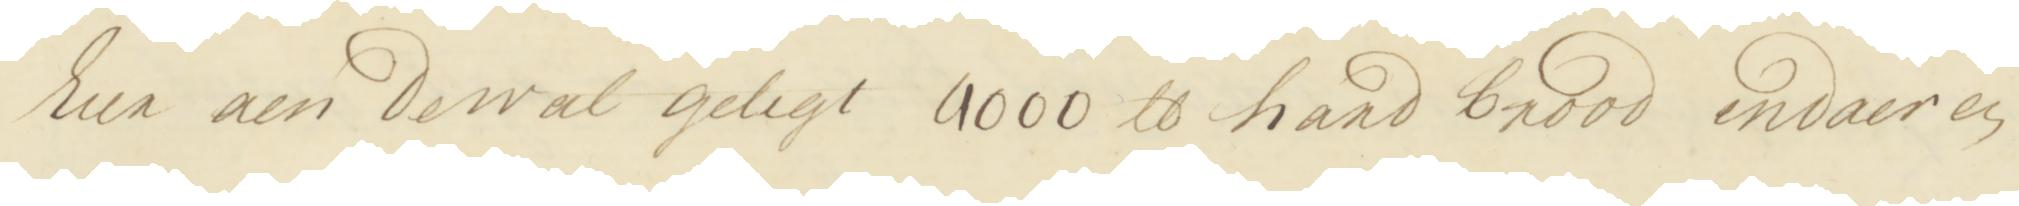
hier aen dewal geligt 4000 lb hard brood endaer en
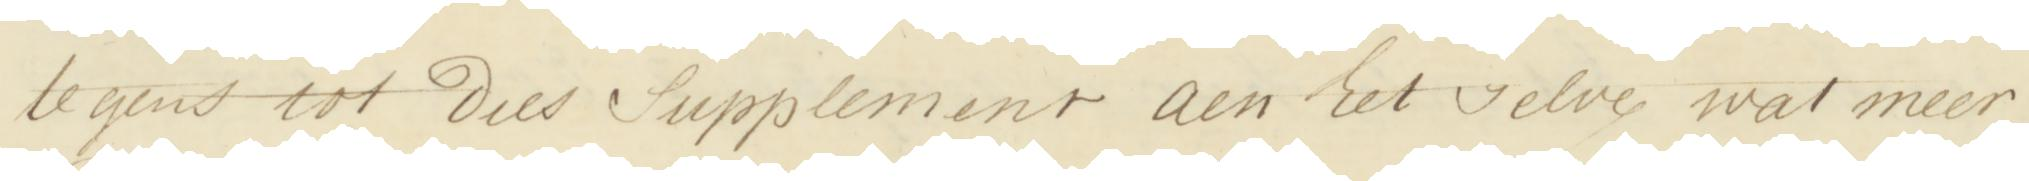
tegens tot dies supplement aen het selve wat meer
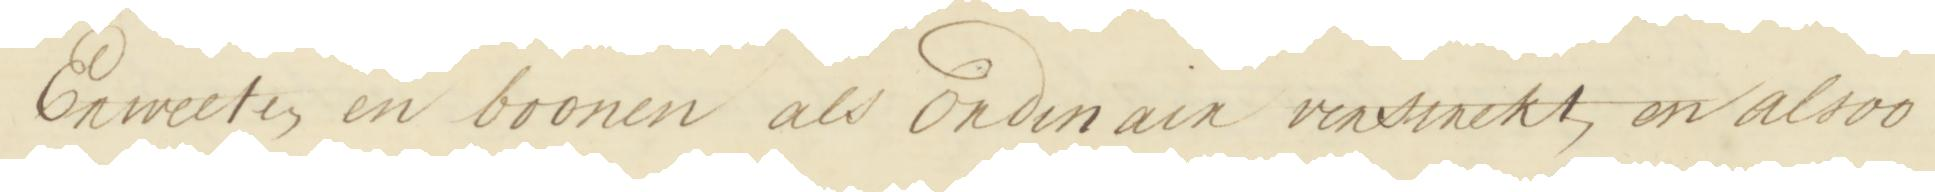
Erweeten en boonen als ordinair verstrekt, en alsoo
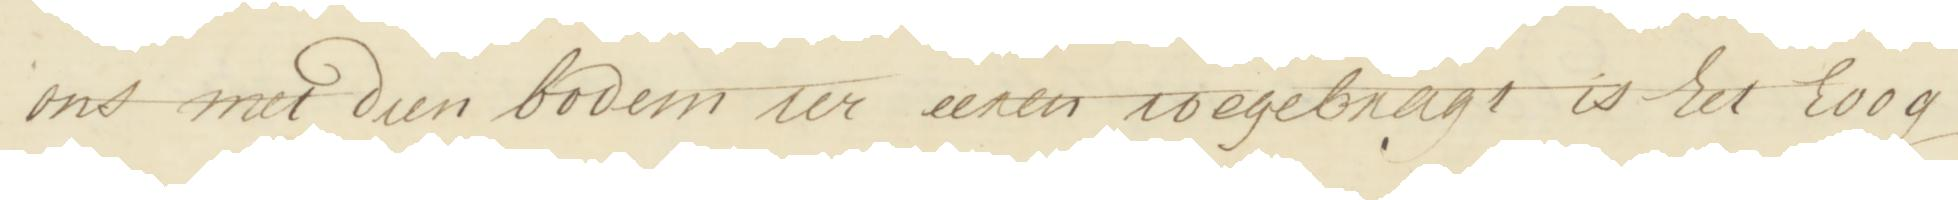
ons met dien bodem ter eeren toegebragt is het hoog
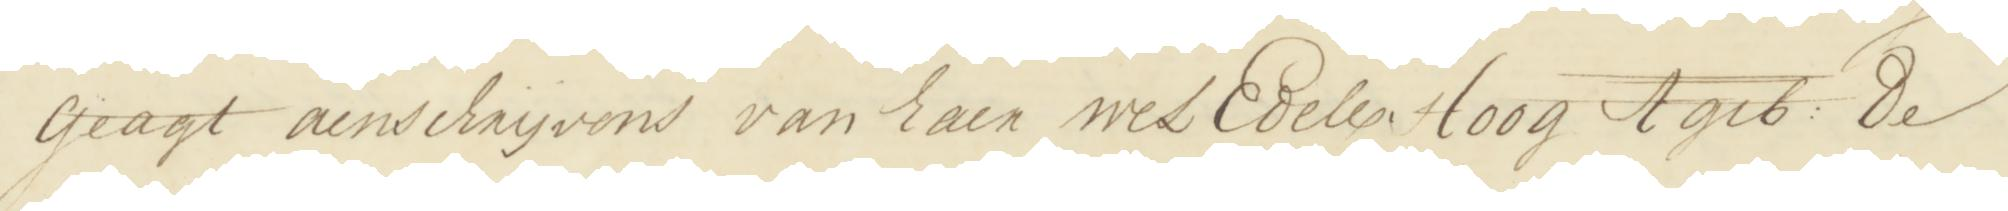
geagt aenschrijvens van haer wel Edele Hoog Agtb: de
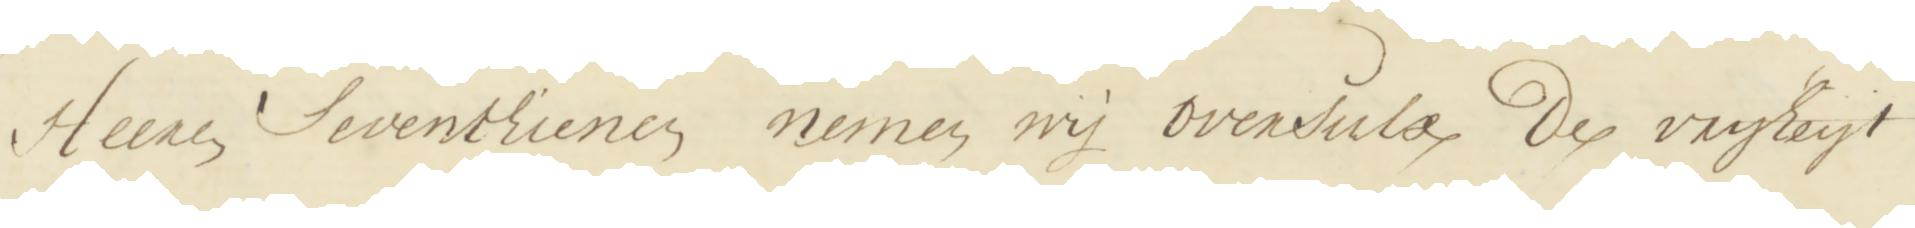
Heeren seventhienen nemen wij oversulx de vryheijt
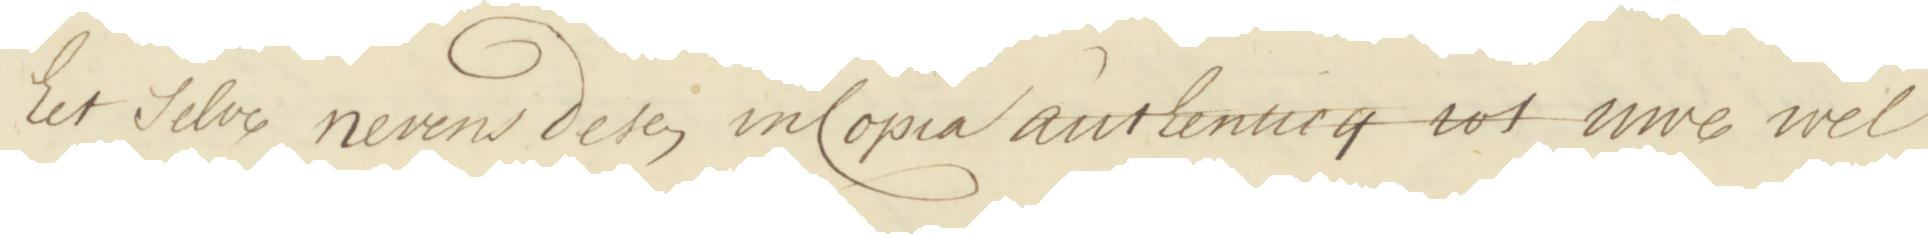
het selve nevens desen in Copia authenticq tot uwe wel
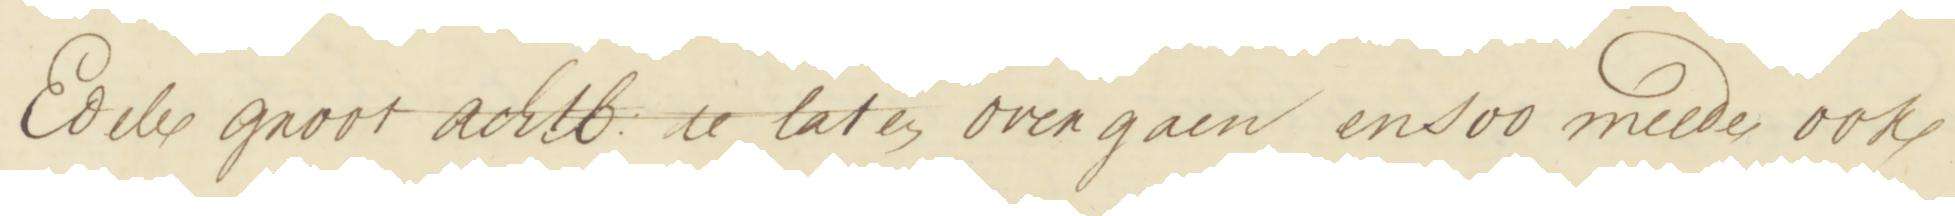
Edele groot achtb: te laten overgaen en soo meede ook
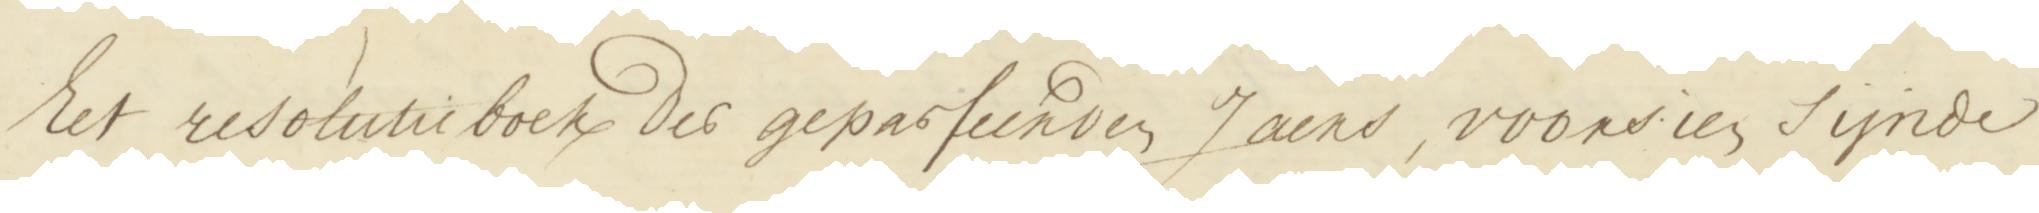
het resolutieboek des gepasseerden Jaers, voorsien sijnde
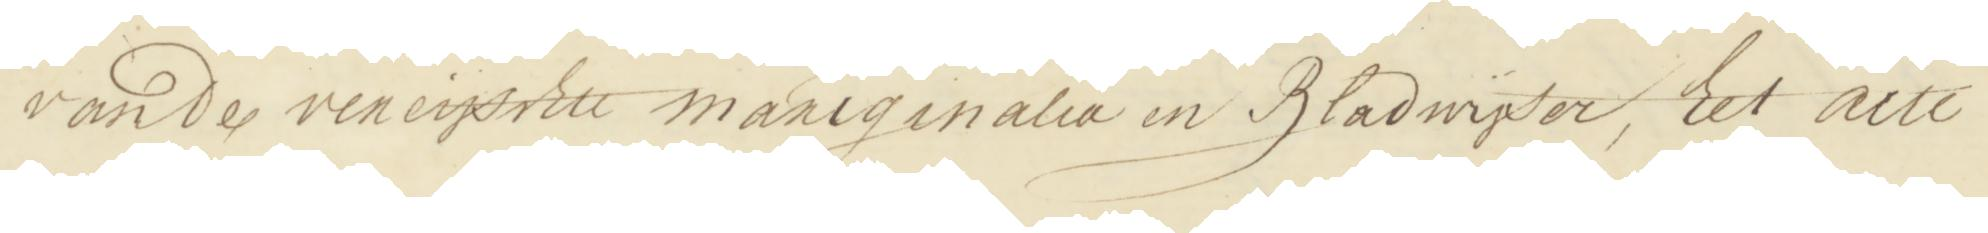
van de vereijschte mariginalia en Bladwijser, het acte
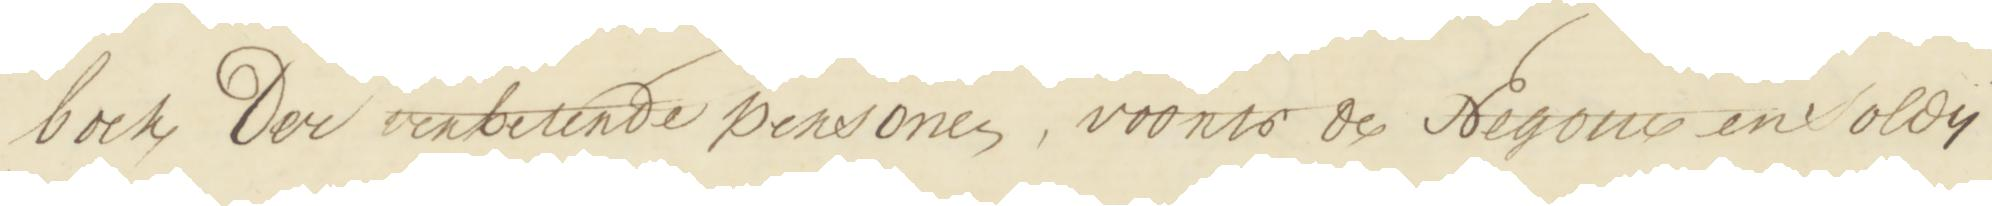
boek der verbeterde personen, voorts de Negotie en soldij
